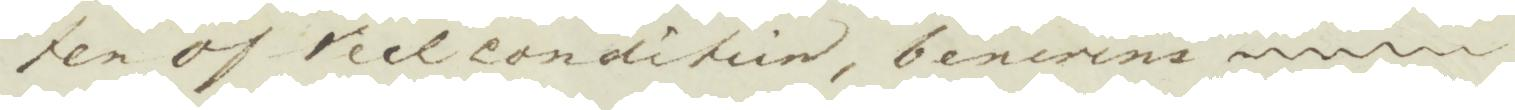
ten of veel conditien, benevens
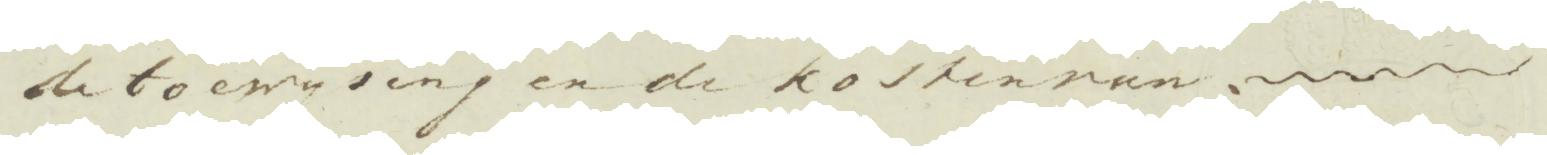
de toewysing en de kosten van
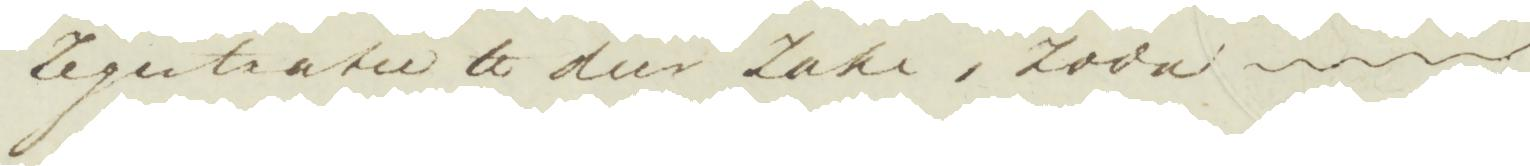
registratie te dier zake, zoda
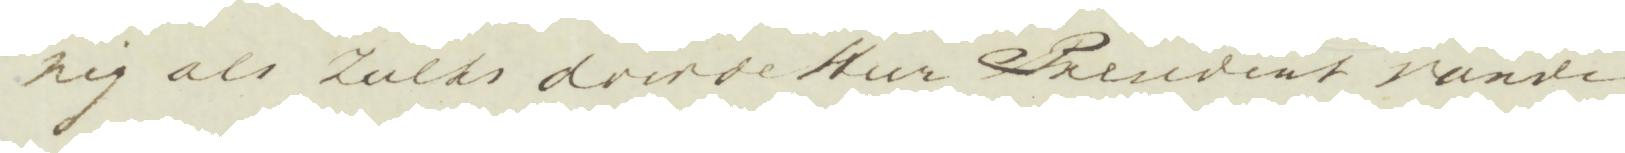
nig als zulks door de Heer President vande
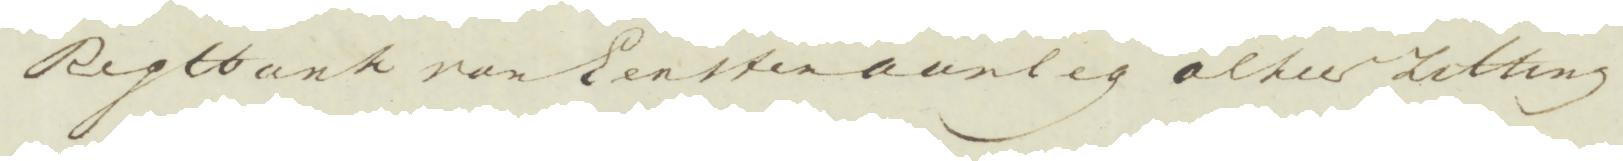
Regtbank van Eersten aanleg alhier zittting
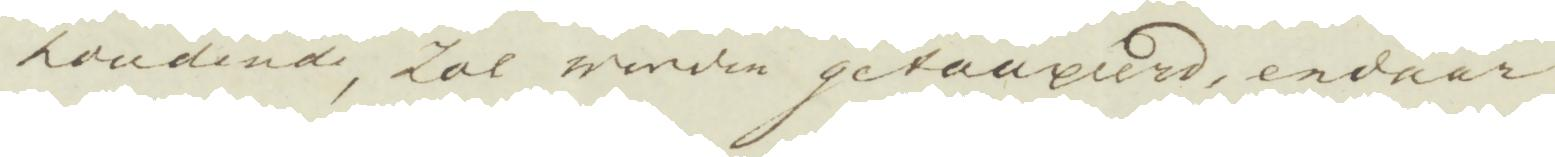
houdende, zal worden getauxeerd, en daar
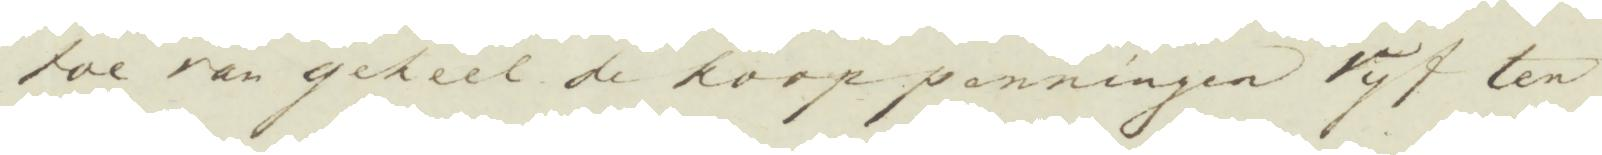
toe van geheel de koop penningen vijf ten
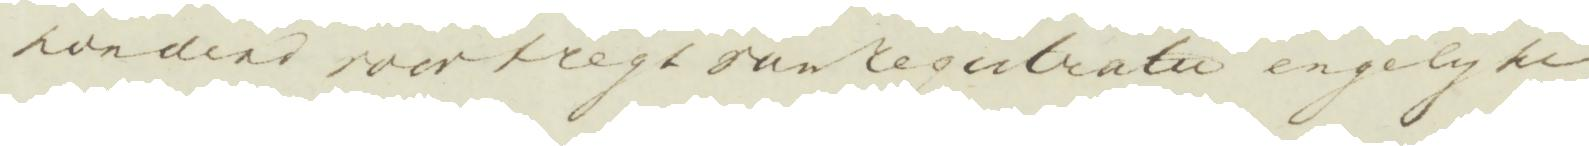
honderd voor 't regt van registratie en gelijke
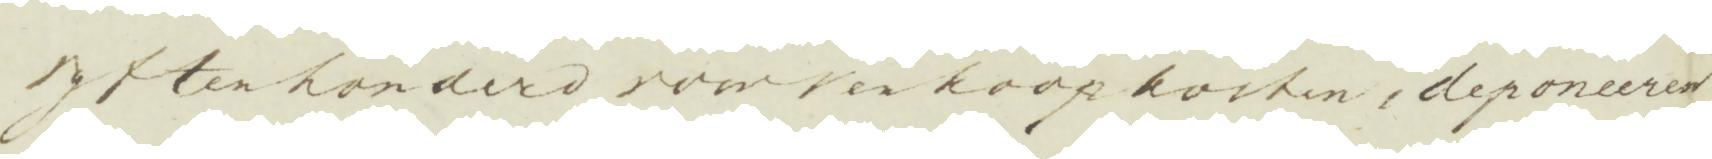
vyf ten honderd voor verkoop kosten, deponeeren
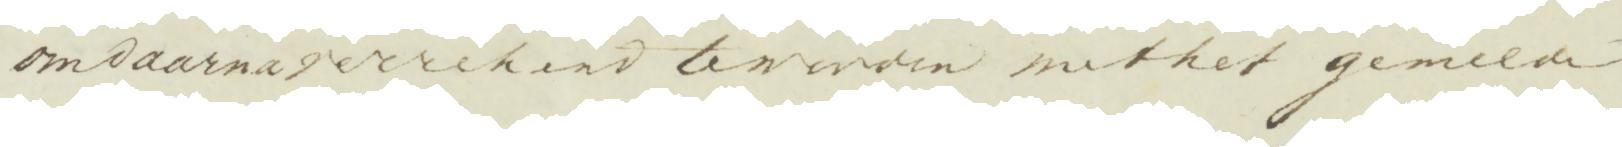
om daarna verrekend te worden met het gemelde
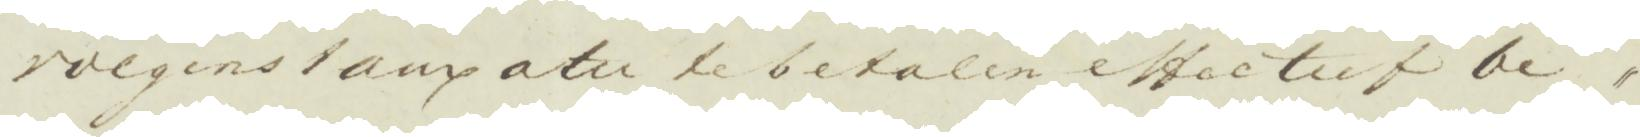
volgens tauxatie te betalen effectief be„
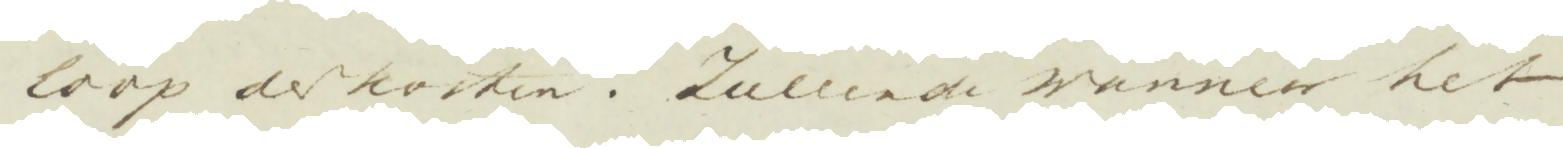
loop der kosten. Zullende wanneer het
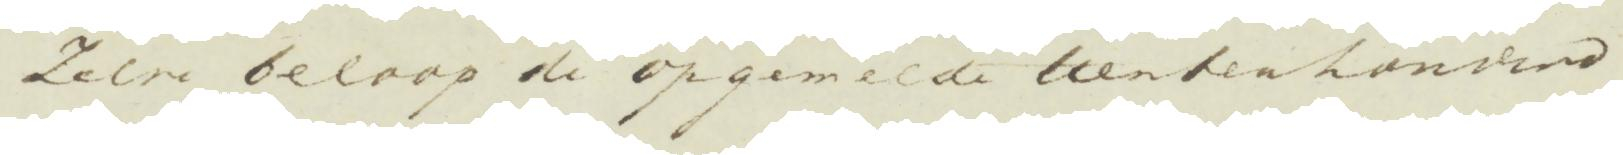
zelve beloop de opgemelde tien ten honderd
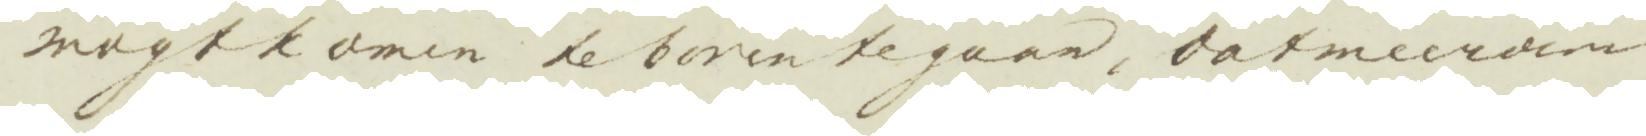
mogt komen te boven te gaan, dat meerderen
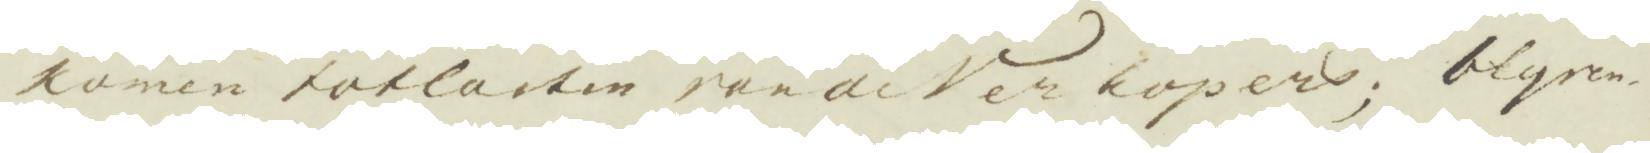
komen tot lasten van de Ver kopers; blyven-
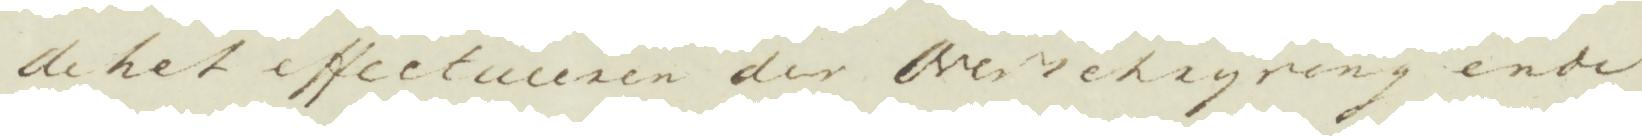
de het effectueeren der Overschrijving ende
